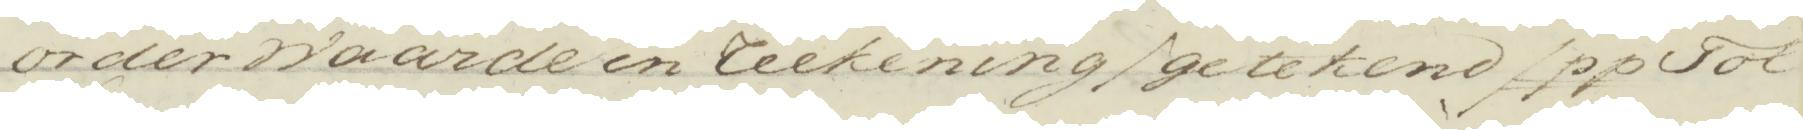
order waarde en reekening /getekend/ pp Tol
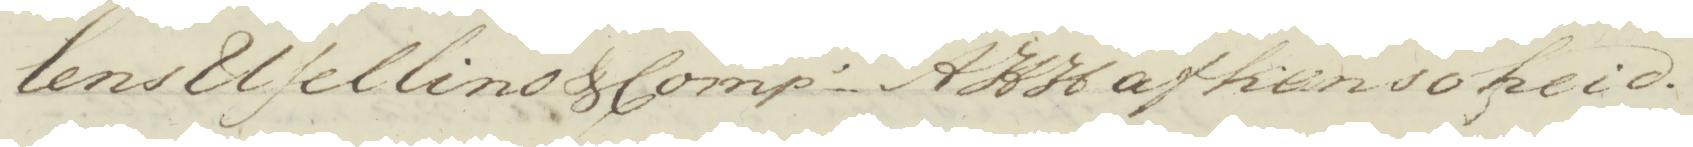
lens Usellino & Comp AHH afkenscheid.
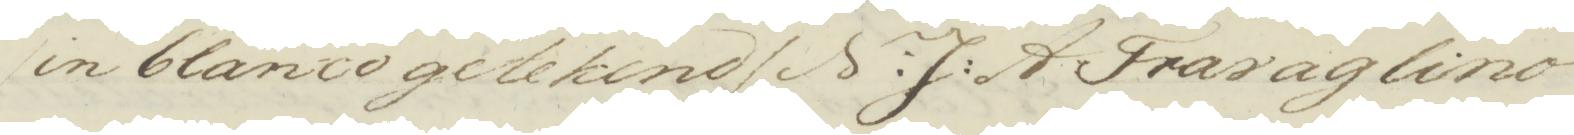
/in blanco getekend/ N: J: A Fravaglino
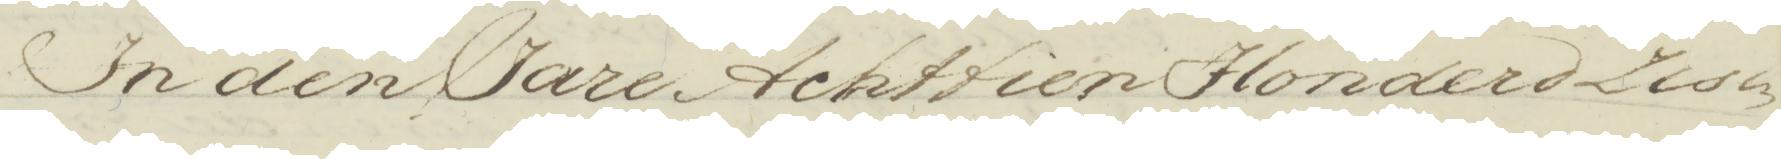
In den Iare Achttien Honderd Zesen
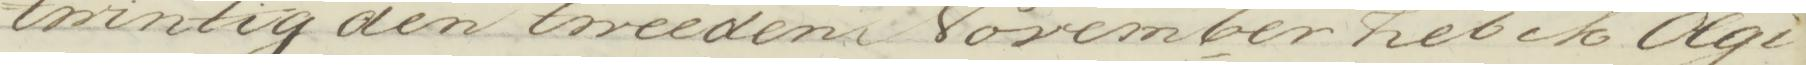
twintig den tweeden November heb ik AEgi
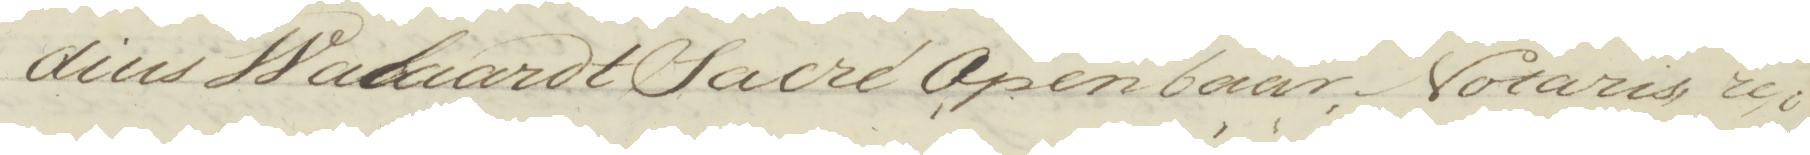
dius Walaardt Sacré, Openbaar Notaris resi
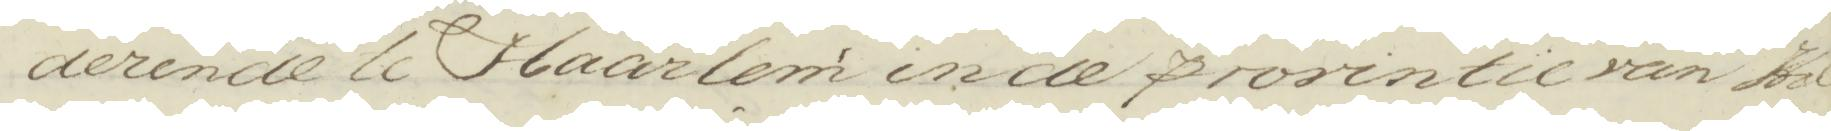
derende te Haarlem in de provintie van Hol
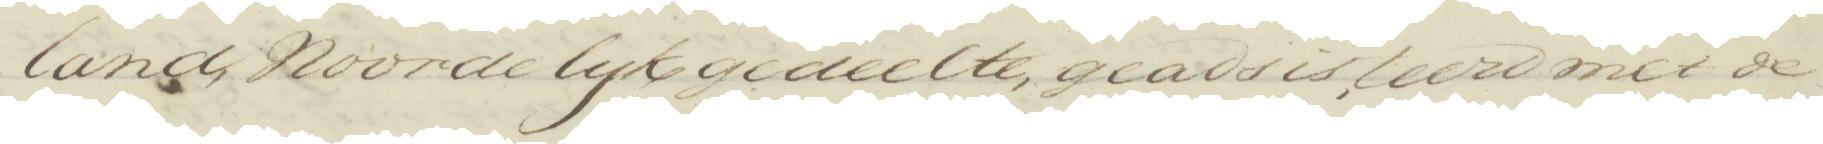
land Noordelyk gedeelte, geadsisteerd met de
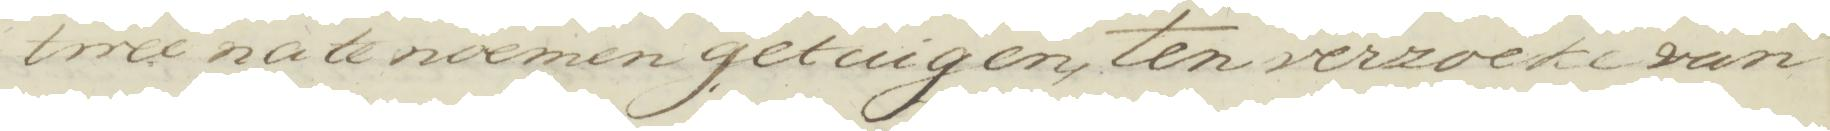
twee na te noemen getuigen, ten verzoeke van
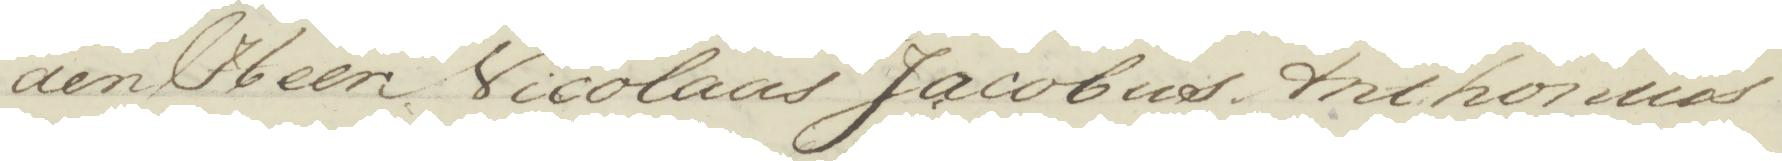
den Heer Nicolaas Jacobus Anthonius
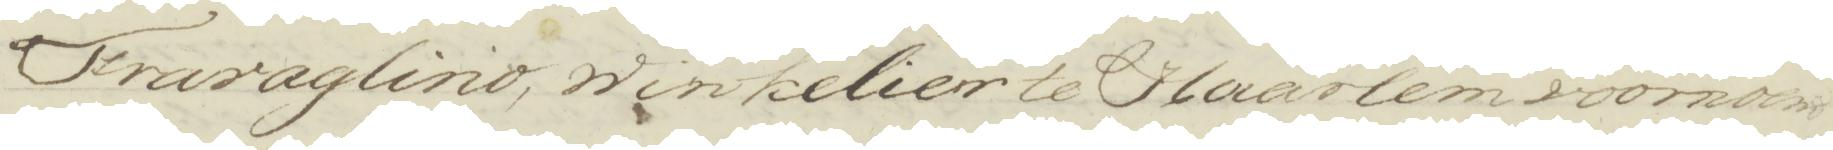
Fravaglino, winkelier te Haarlem voornoemd
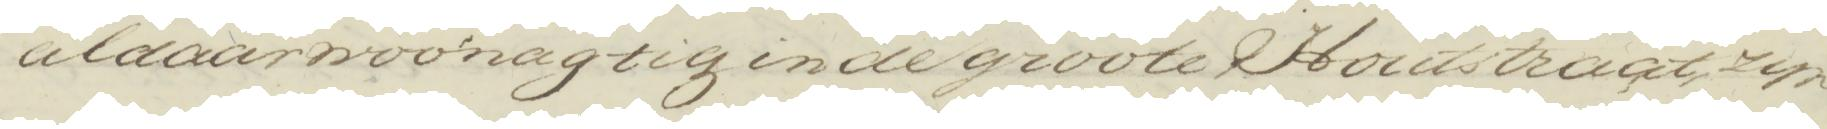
aldaar woonagtig in de groote Houtstraat, zyn
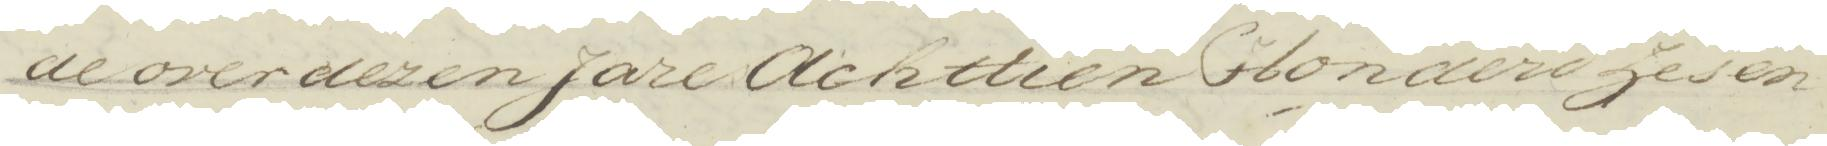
de over dezen Jare Achttien Honderd Zes en
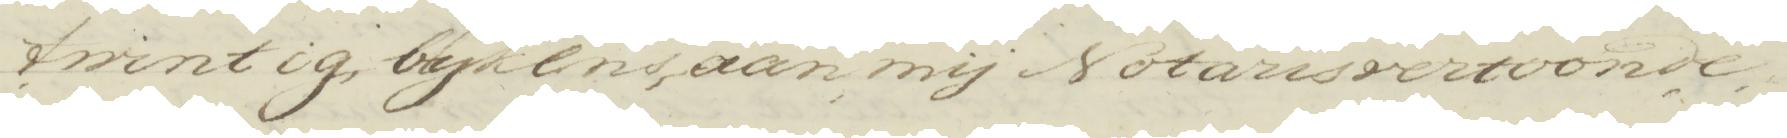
twintig, blykens, aan my Notaris vertoonde
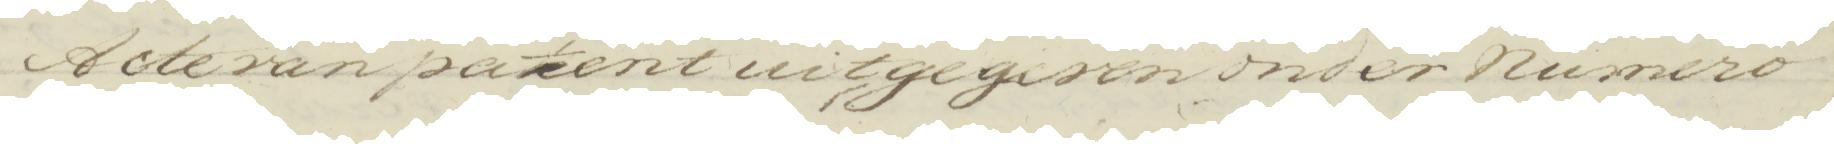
Acte van patent uitgegeven onder Numero
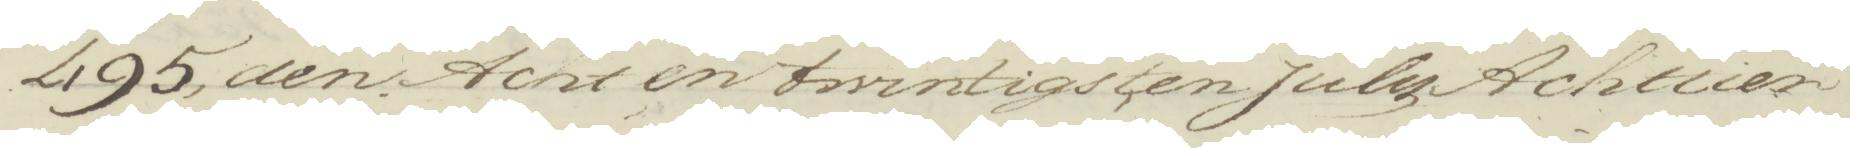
495, den Acht en twintigsten July Achttien
